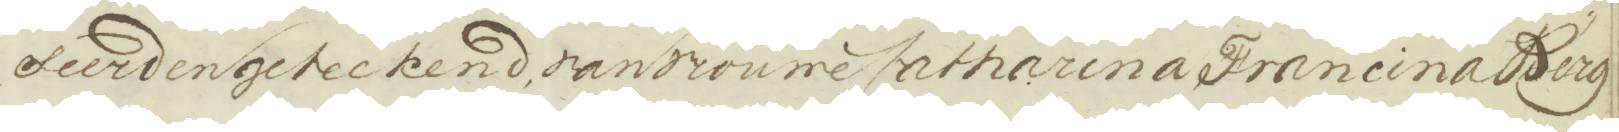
„seerd en geteekend, van Vrouwe Catharina Francina Berg
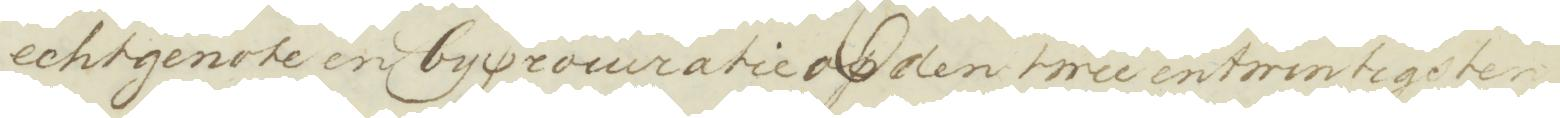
echtgenote en by procuratie op den twee en twintigsten
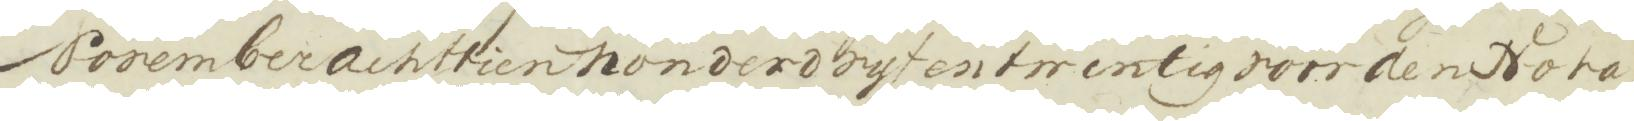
November achttien honderd vyf en twintig voor den Nota
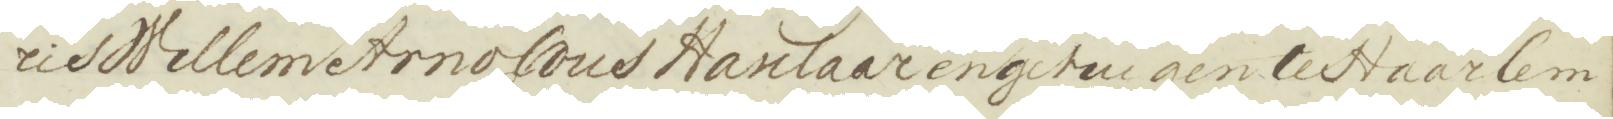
ris Willem Arnoldus Haselaar en getuigen te Haarlem
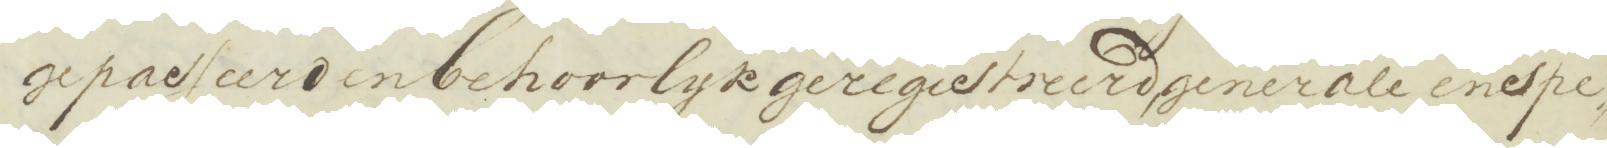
gepasseerd en behoorlyk geregistreerd, generale en spe„
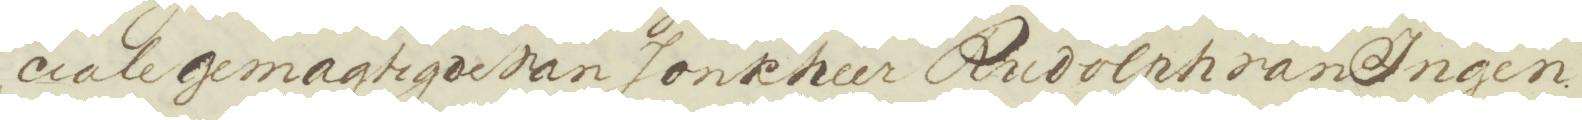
„ciale gemagtigde van Jonkheer Rudolph van Ingen
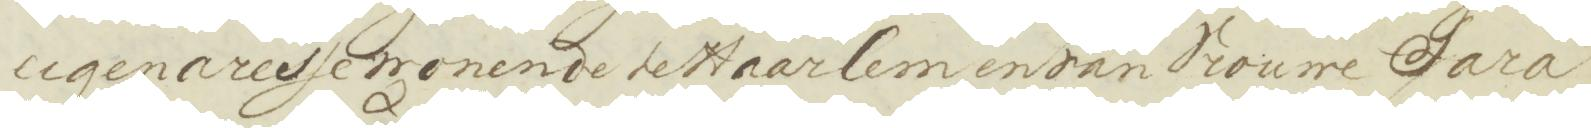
eigenaresse wonende te Haarlem en van Vrouwe Sara
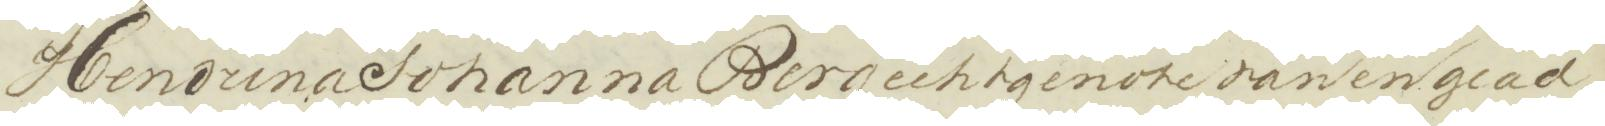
Hendrina Iohanna Berg echtgenote van en gead
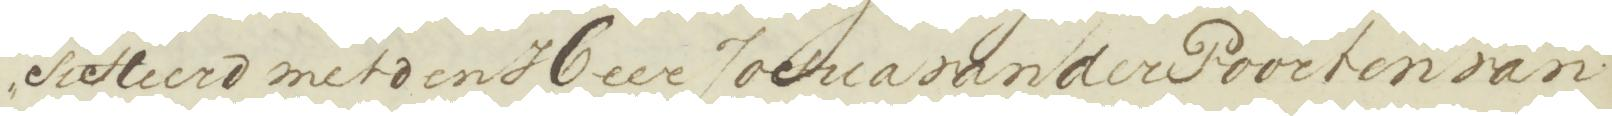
„sisteerd met den Heer Josua van der Poorten van
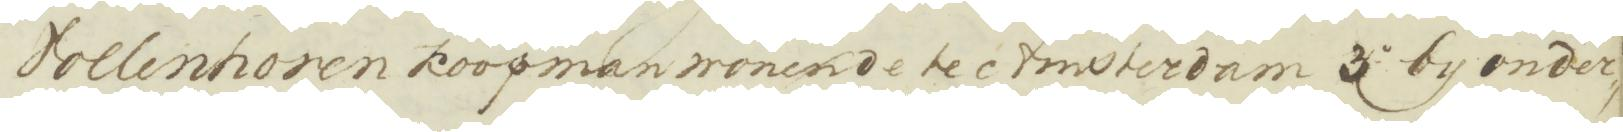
Vollenhoven koopman wonende te Amsterdam 3o by onder„
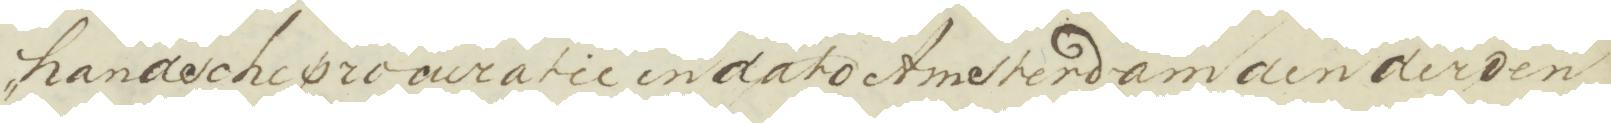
„handsche procuratie in dato Amsterdam den derden
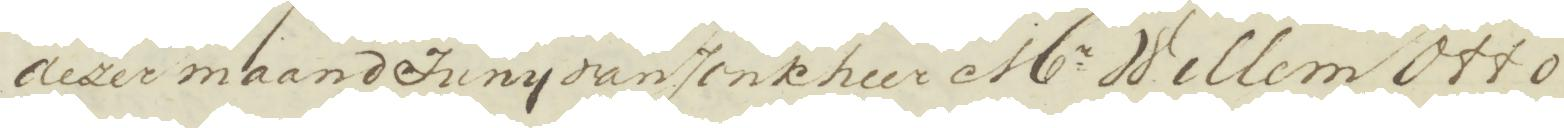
dezer maand Juny van Jonkheer M=r Willem Otto
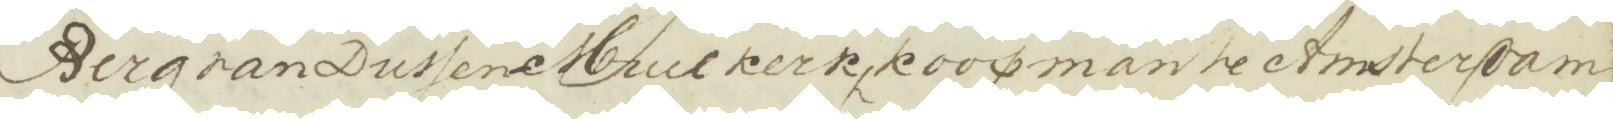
Berg van Dussen Muilkerk, koopman te Amsterdam
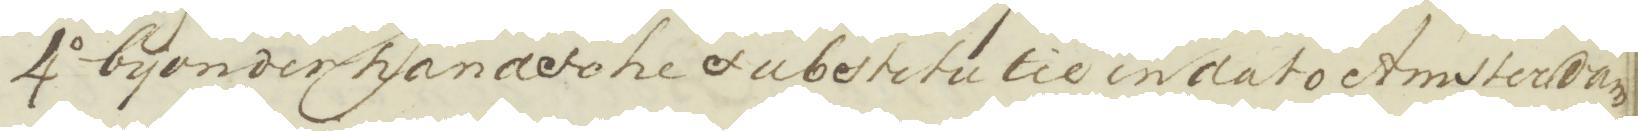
4o by onderhandsche substitutie in dato Amsterdam
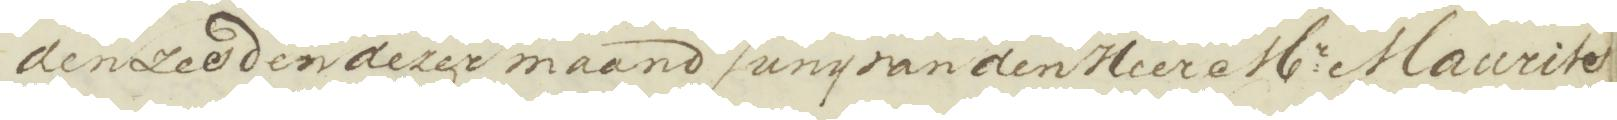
den zesden dezer maand Juny van den Heer M:r Maurits
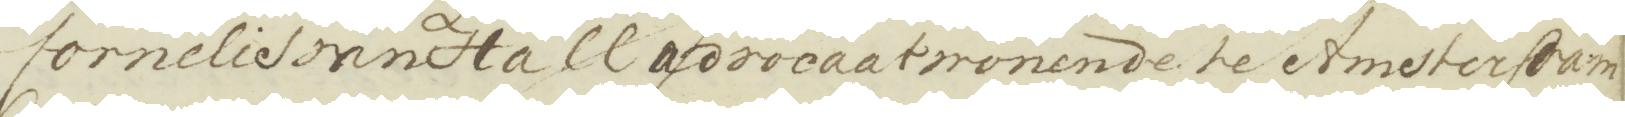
Cornelis Hall advocaat wonende te Amsterdam
